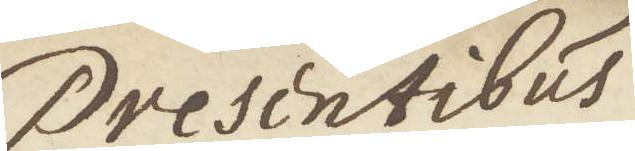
Presentibus
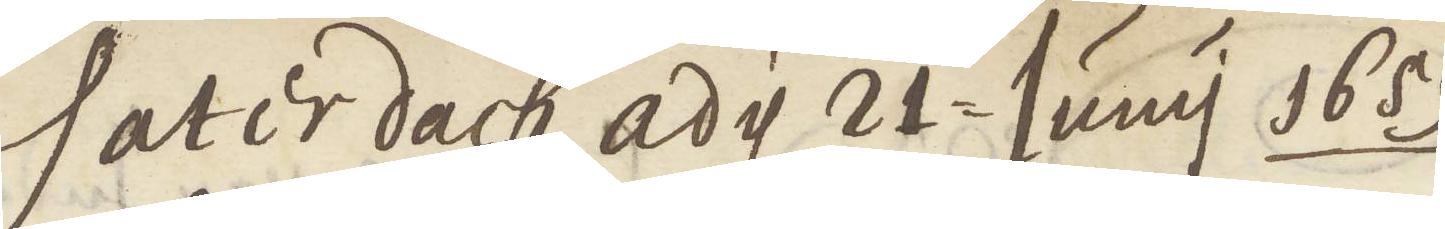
Saterdach adj 21=e Junij 1659
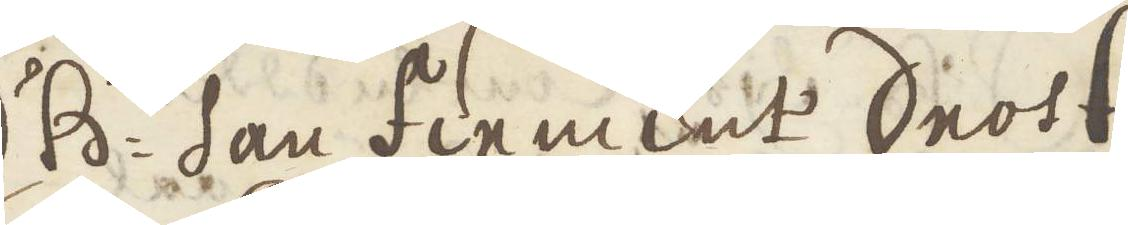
D'H=r Jan Ferment drost
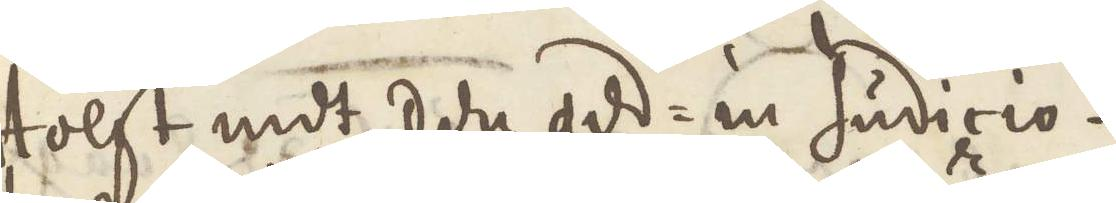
Holst met den ged=e in Judicio -
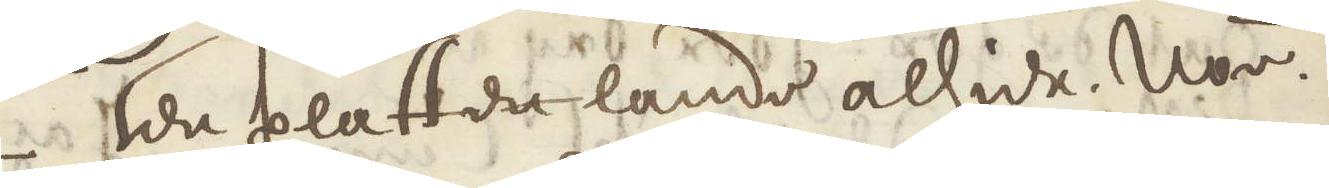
ten plattenlande alhier. Noe.
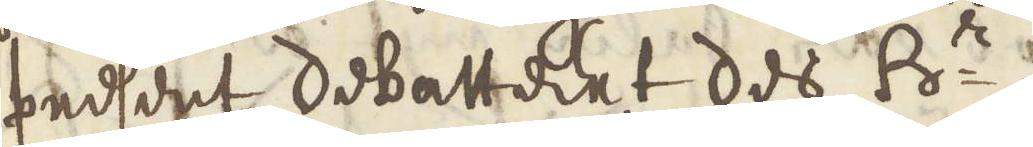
present debatteert des H=r
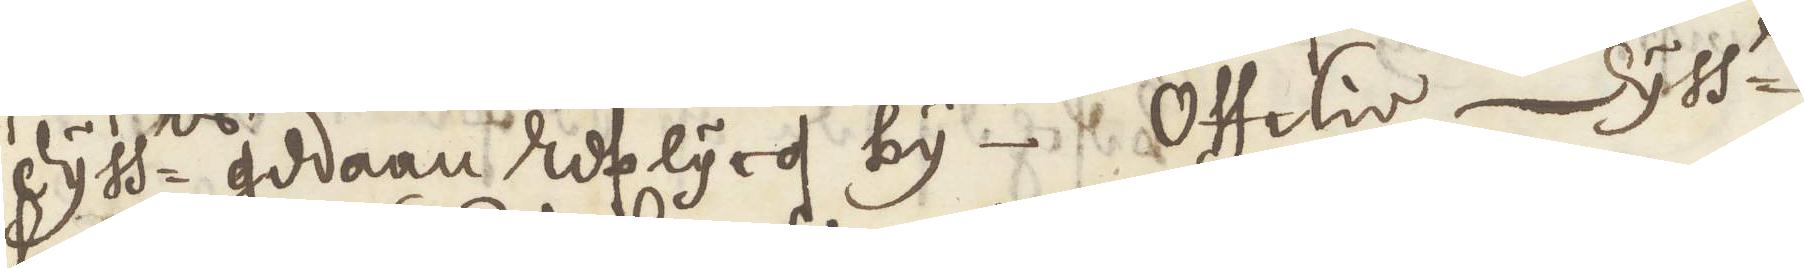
Eijss=rs gedaan replijcq bij — Offitie Eijss=r
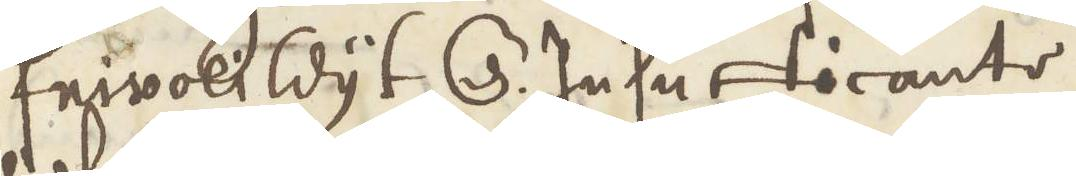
frivoliteijt ende Insufficante
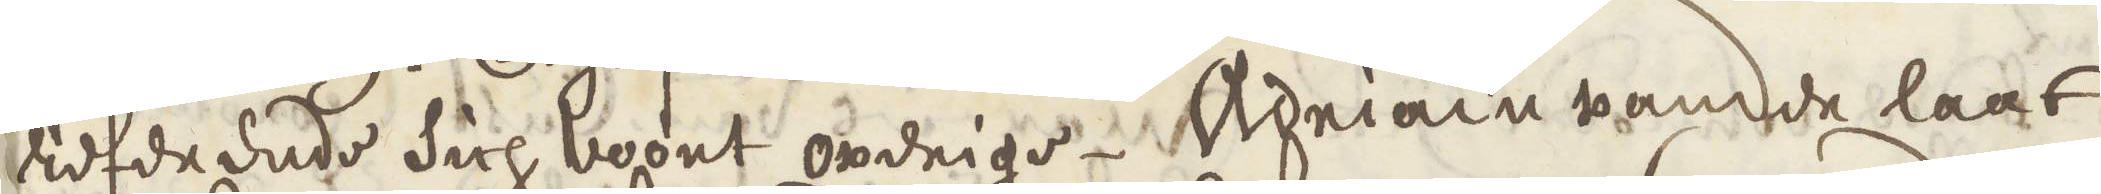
referende sich voort overige Adriaen vander laas
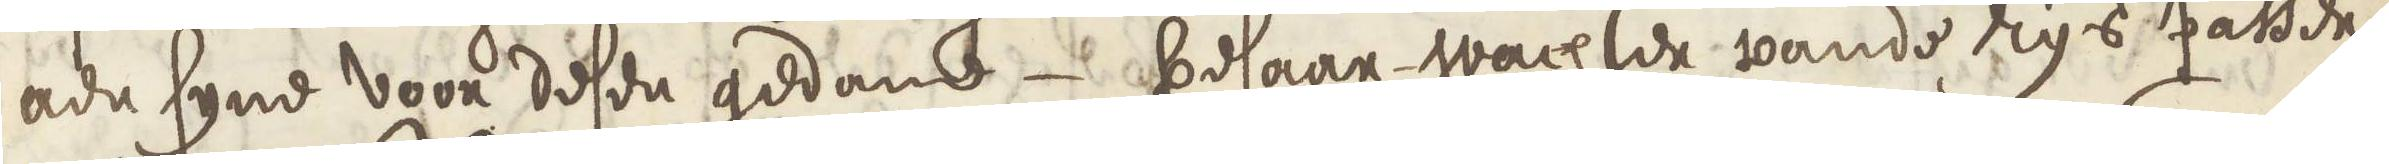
aen syne voor desen gedane — besaar-wachter van de rijs passen
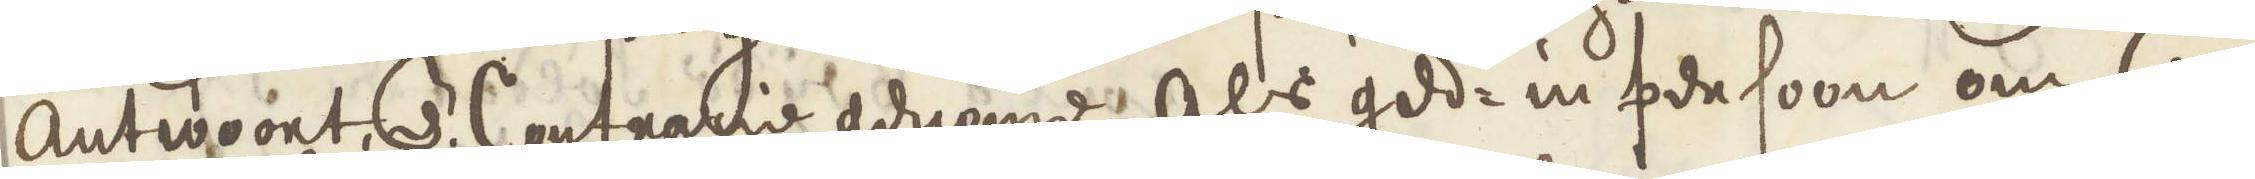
Antwoort, ende Contrarie genome als ged=e in persoon om te
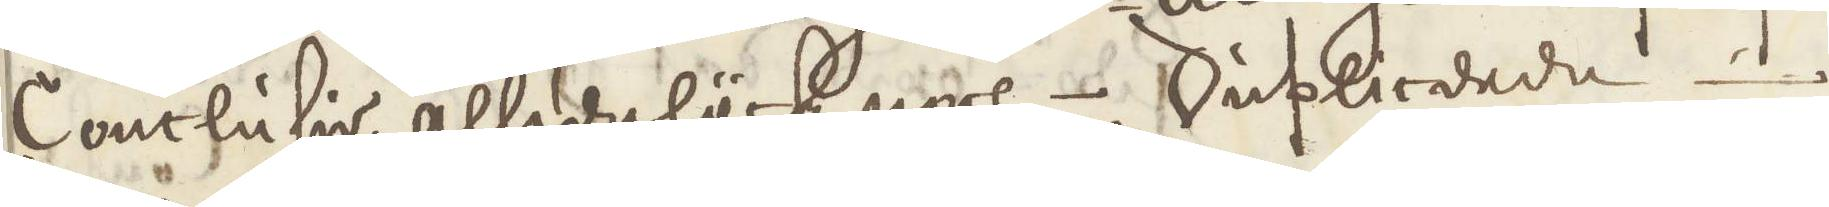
Conclusie, alleenlijck noch — dupliceren —
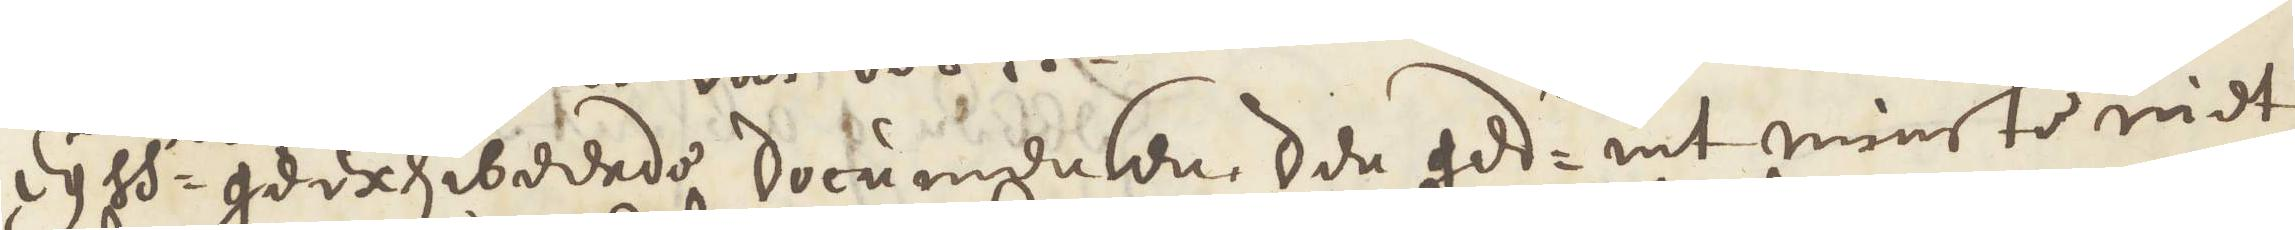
Eijss=rs geexhibeerde documenten den ged=e int minste niet
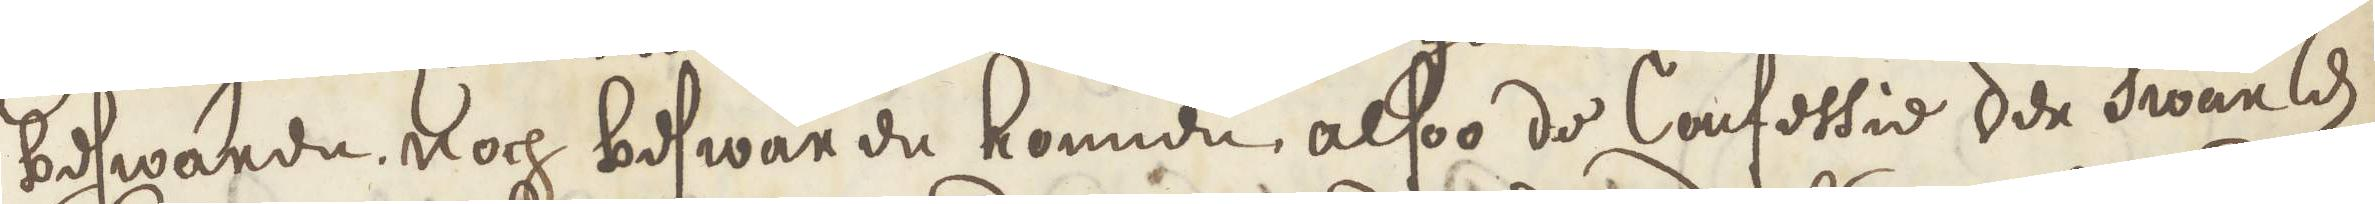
beswaren, noch beswaren konnen, alsoo de Confessie der swarten
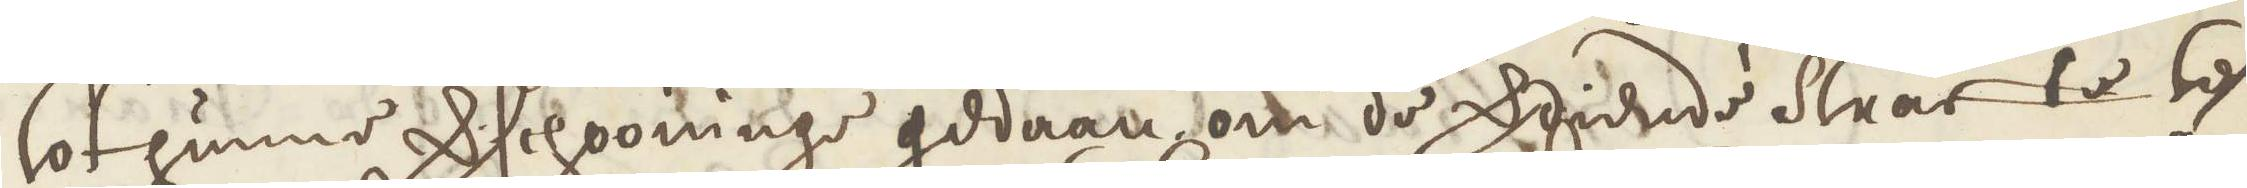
tot hunne verschooninge gedaan om de verdiende straffe te
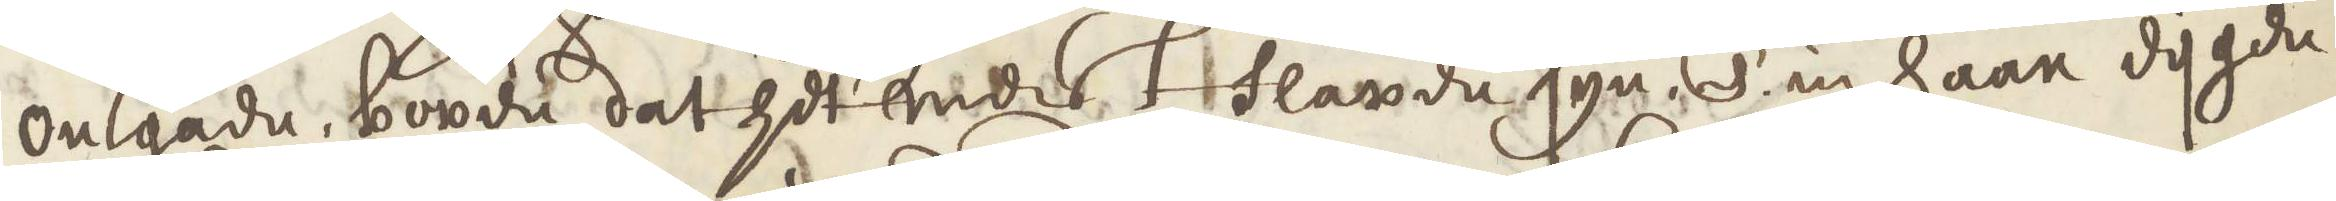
ontgaen, boven dat het meest slaven syn, ende in haar eijgen
